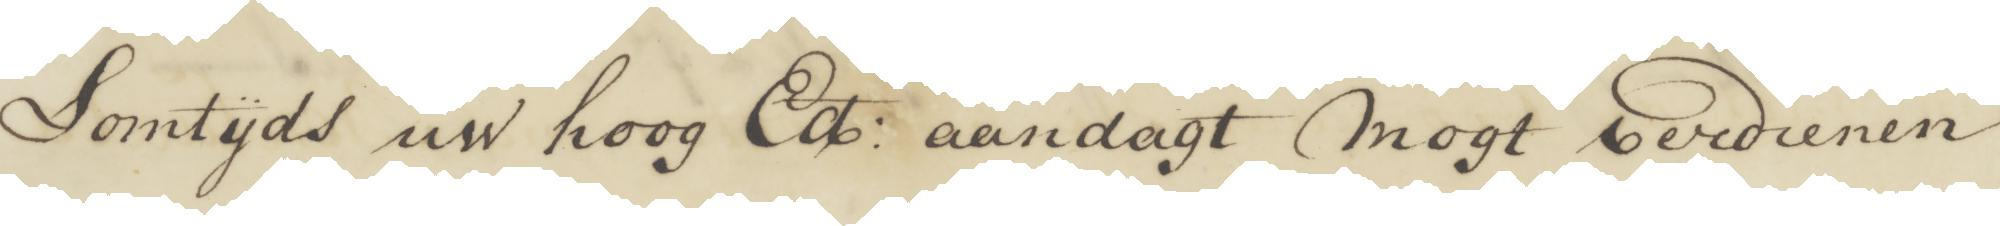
Somtijds uw hoog Ed: aandagt mogt verdienen
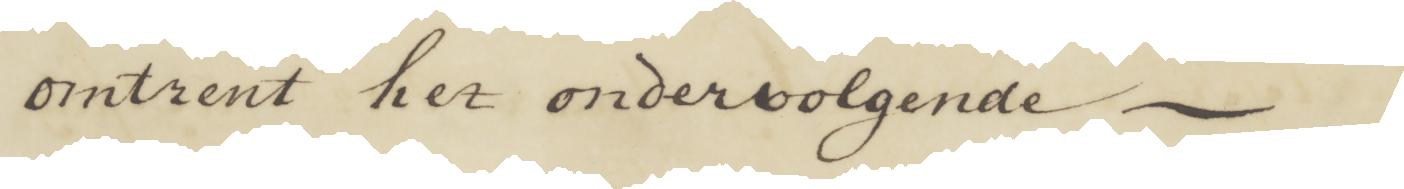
omtrent het ondervolgende —
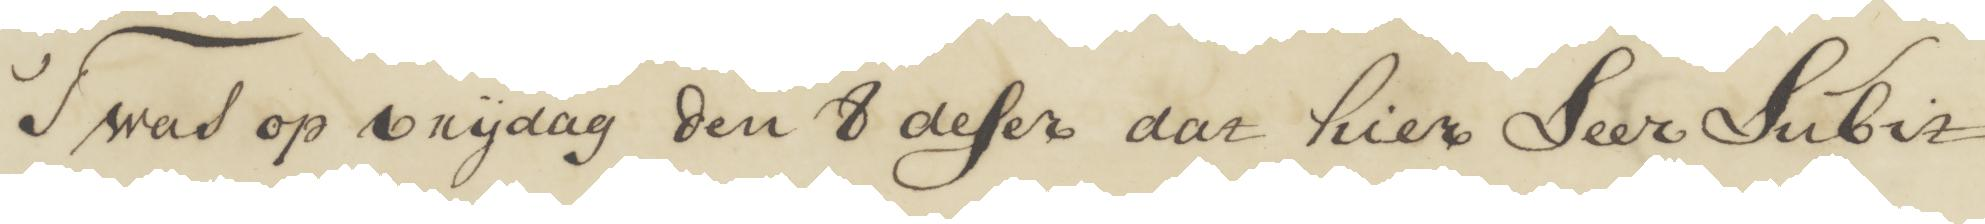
'T was op vrijdag den 8 deser dat hier seer subit
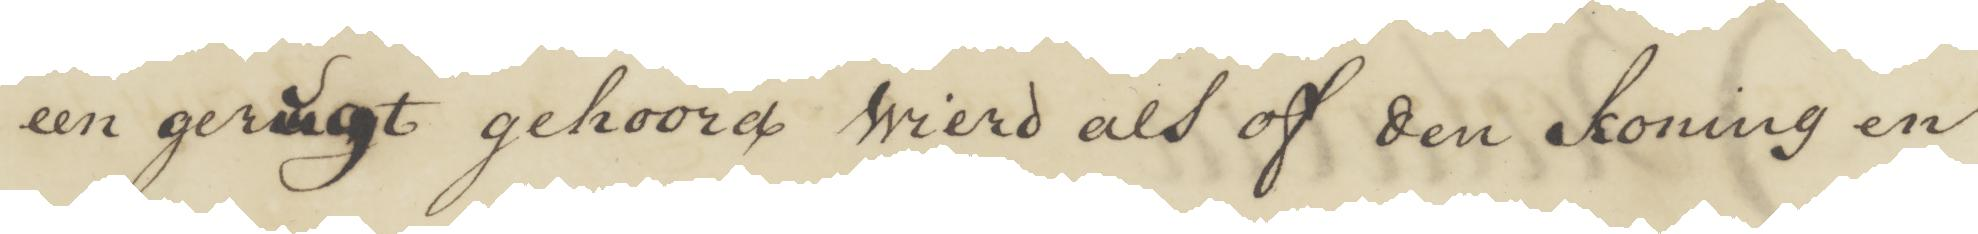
een gerugt gehoord wierd als of den koning en
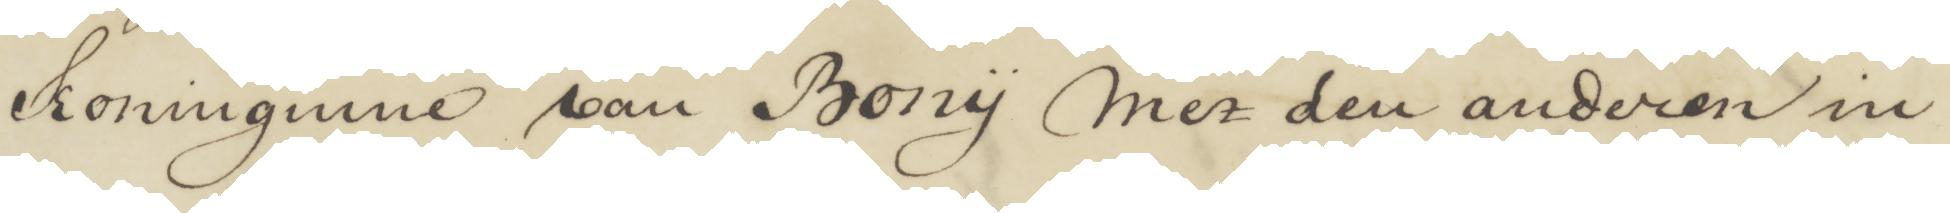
Koninginne van Bonij met den anderen in
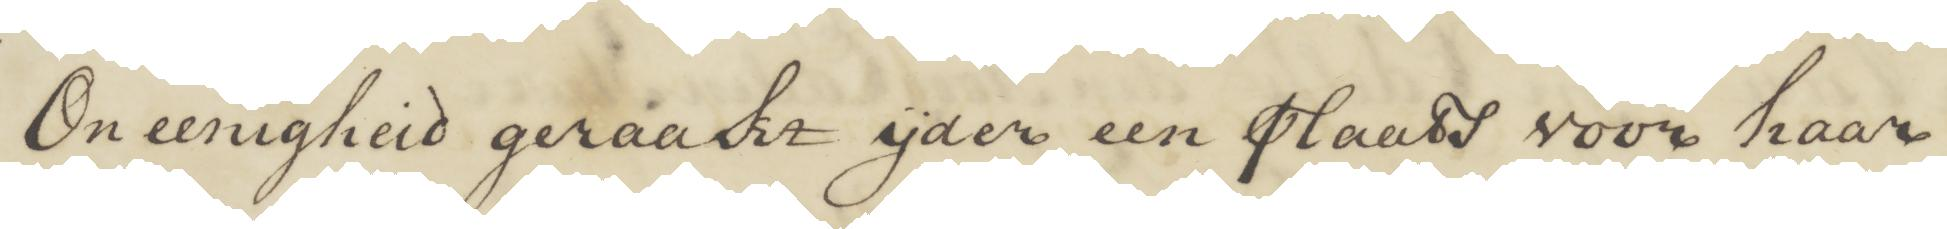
On eenigheid geraakt ijder een plaads voor haar
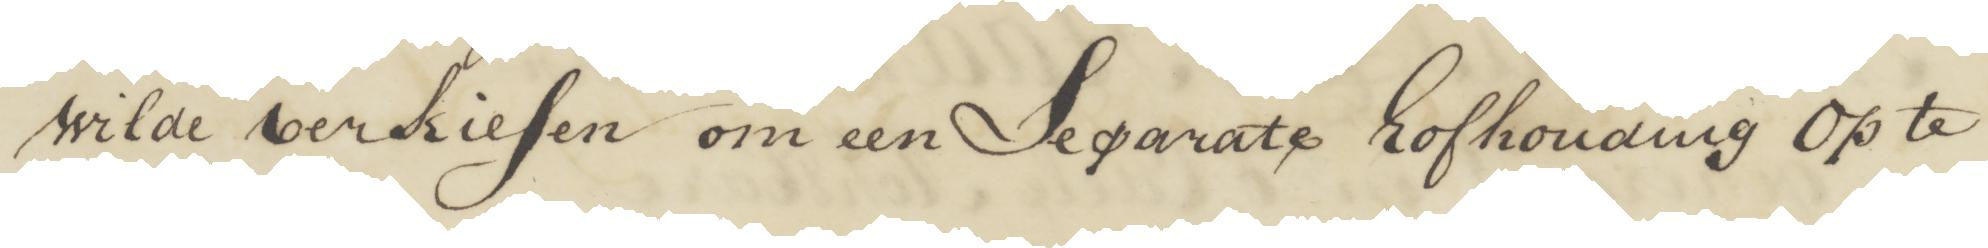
wilde verkiesen om een Separate hofhouding op te
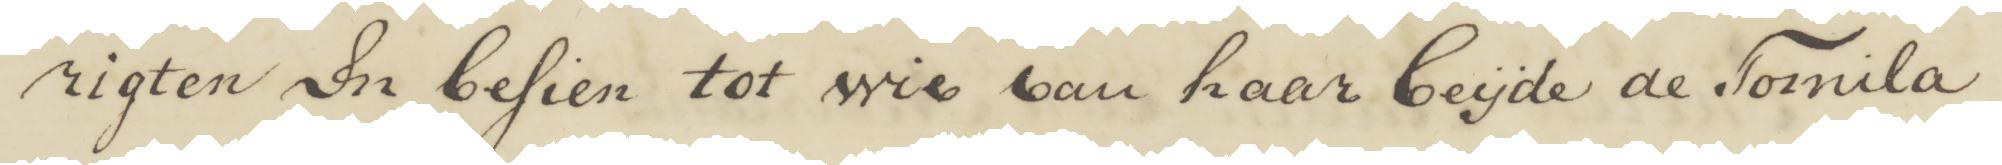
rigten En besien tot wie van haar beijde de Tomila
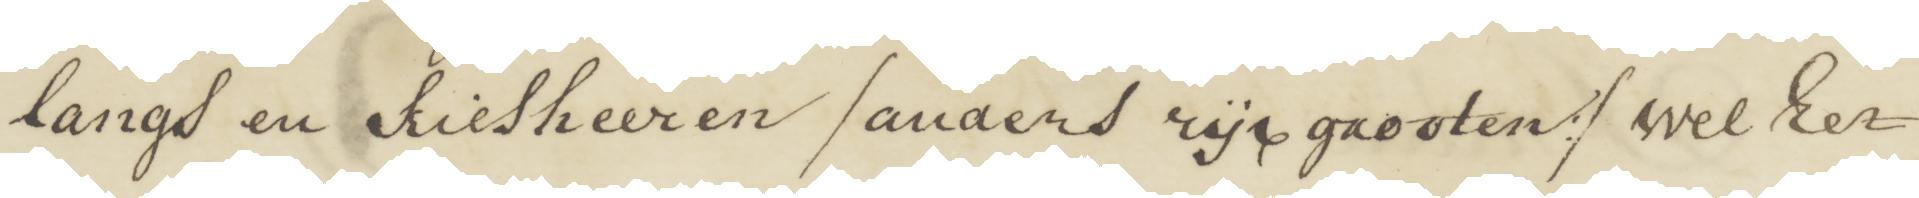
langs en kiesheeren /anders rijx grooten:/ wel het
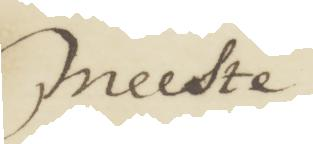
meeste
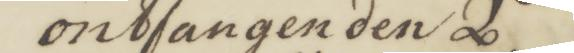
ontfangen den 2de
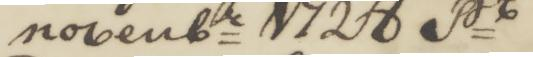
novemb=r 1728 P=r
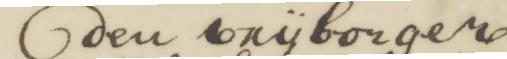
den vrijborger
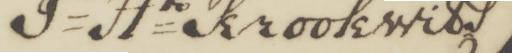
I=n H=k Krookwits
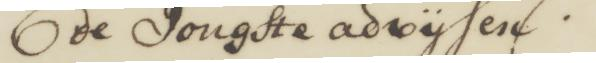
de Iongste advijsen
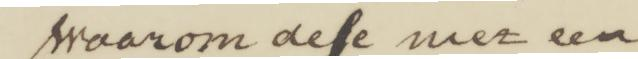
waarom dese met een
